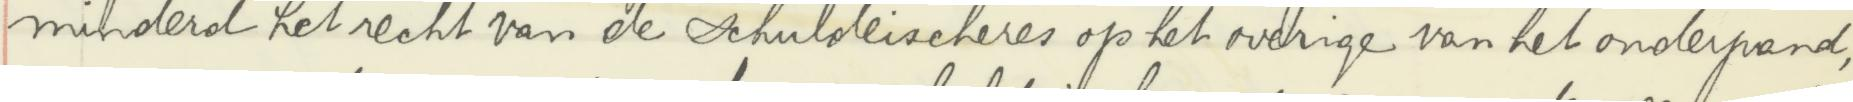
minderd het recht van de schuldeischeres op het overige van het onderpand,
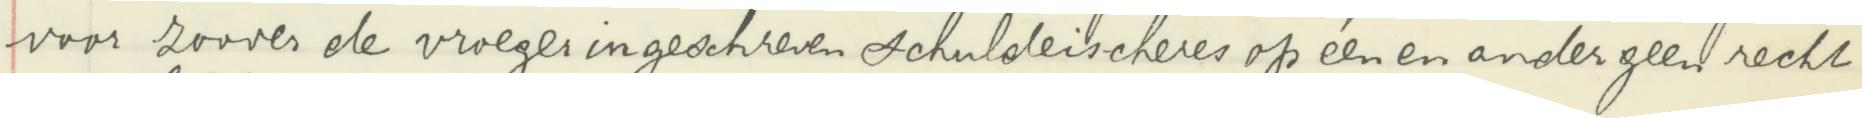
voor zoover de vroeger ingeschreven schuldeischeres op een en ander geen recht
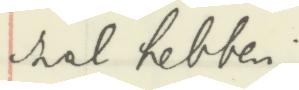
zal hebben;
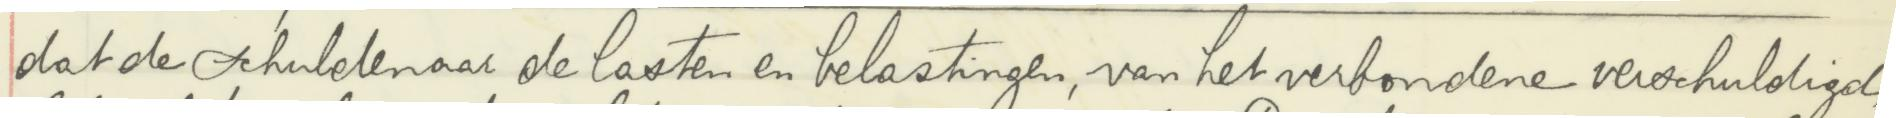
dat de schuldenaar de lasten en belastingen, van het verbondene verschuldigd,
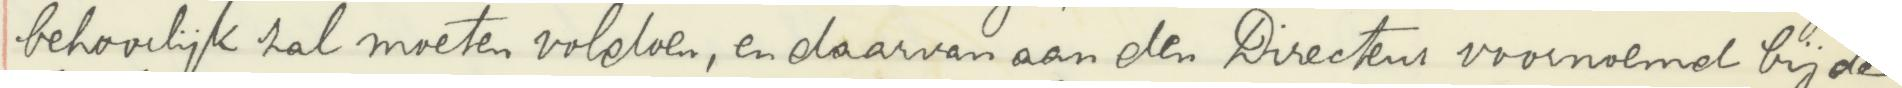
behoorlijk zal moeten voldoen, en daarvan aan den Directeur voornoemd bij de
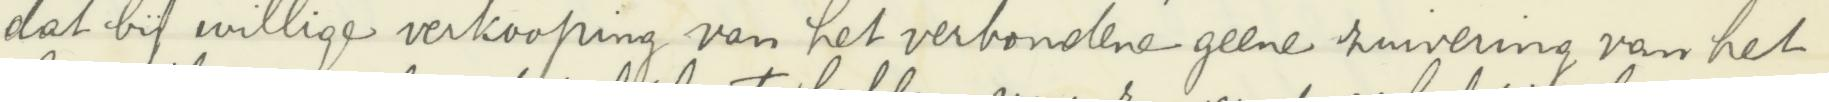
dat bij willige verkooping van het verbondene geene zuivering van het
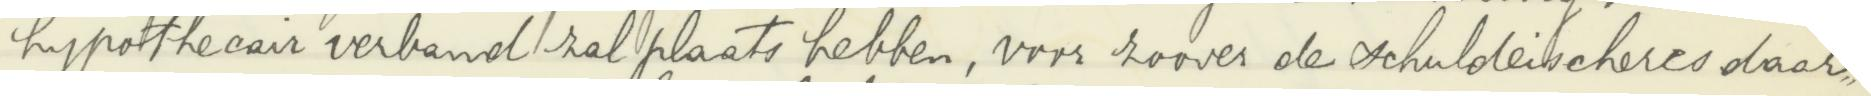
hypothecair verband zal plaats hebben, voor zoover de schuldeischeres daar„
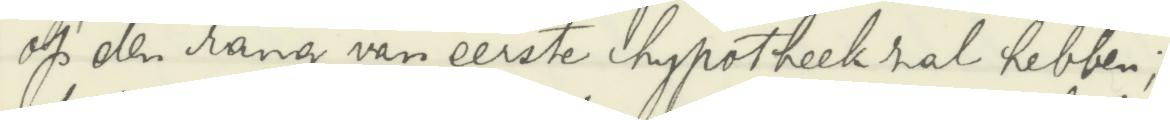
op den rang van eerste hypotheek zal hebben;
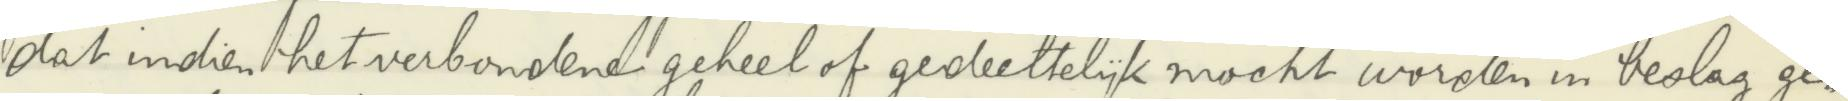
dat indien het verbondene geheel of gedeeltelijk mocht worden in beslag ge„
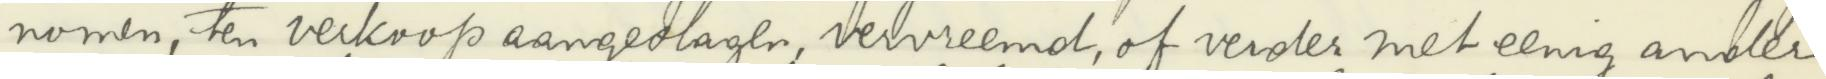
nomen, ten verkoop aangeslagen, vervreemd, of verder met eenig ander
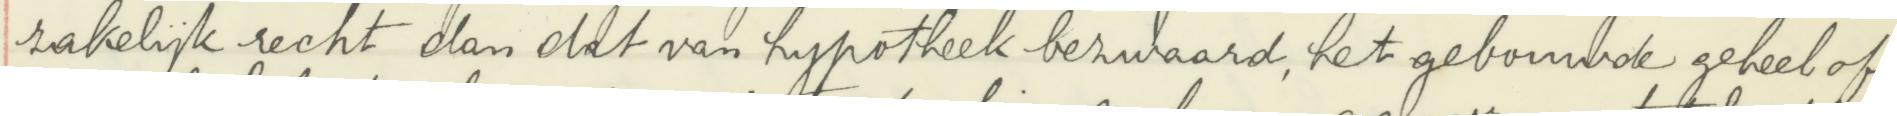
zakelijk recht dan dat van hypotheek bezwaard, het gebouwde geheel of
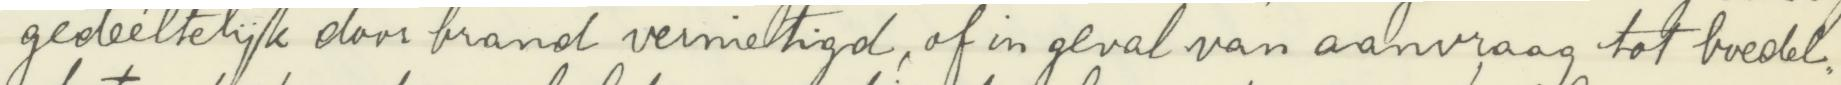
gedeeltelijk door brand vermetigd, of in geval van aanvraag tot boedel„
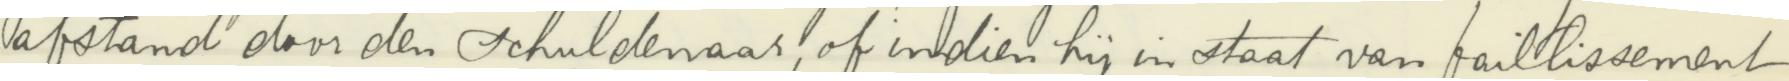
afstand door den schuldenaar, of indien hij in staat van faillissement
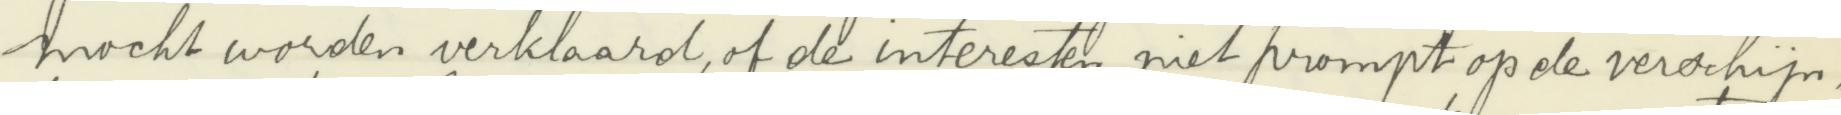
mocht worden verklaard, of de interesten niet prompt op de verschijn
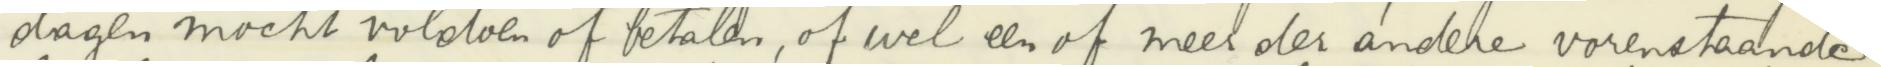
dagen mocht volfoen of betalen, of wel een of meer der andere vorenstaande
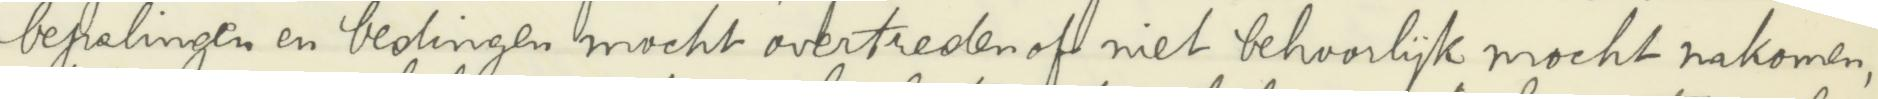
bepalingen en bedingen mocht overtreden of niet behoorlijk mocht nakomen,
